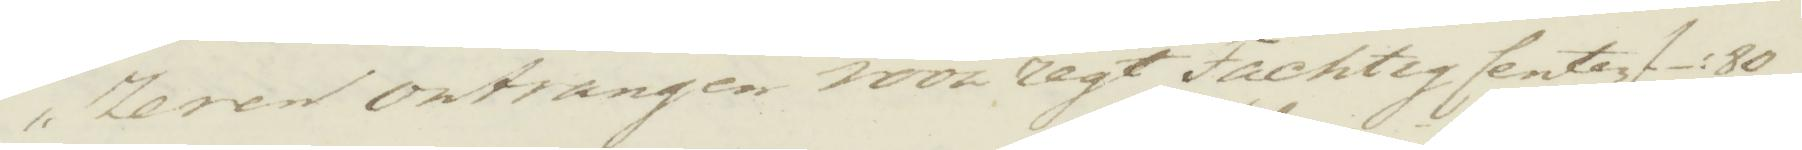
„zeven ontvangen voor regt Tachtig Centen ƒ -: 80
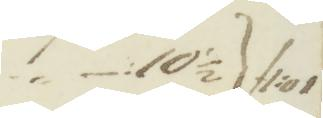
„ —:10½ ƒ1:01
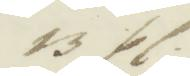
13 pc
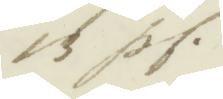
13 pc.
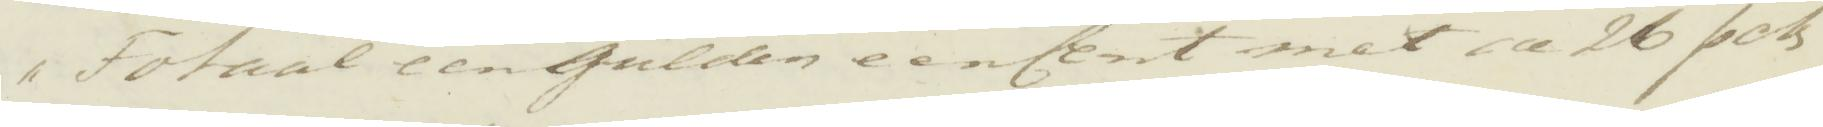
„ Totaal een gulden een Cent met de 26 pcts
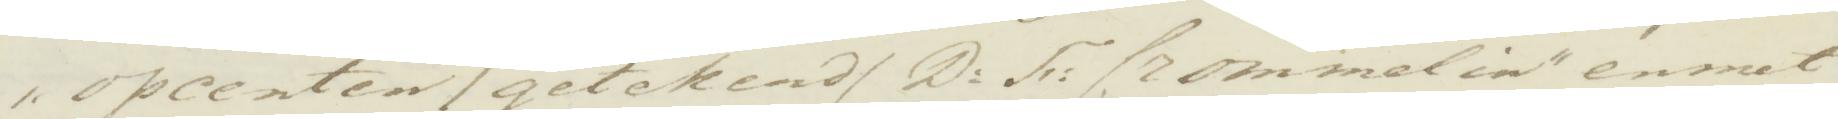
„ opcenten /getekend/ D: F: Crommelin en met
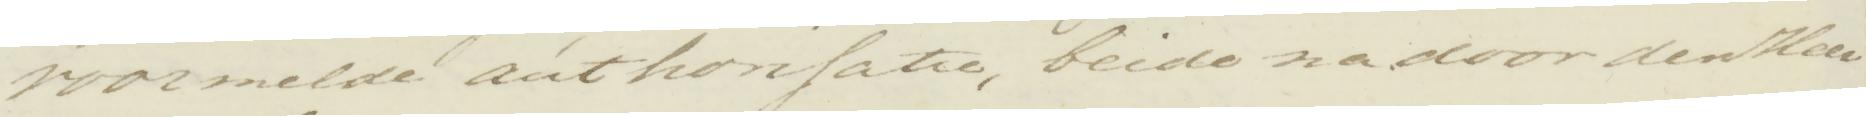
voormelde authorisatie, beide na door den Heer
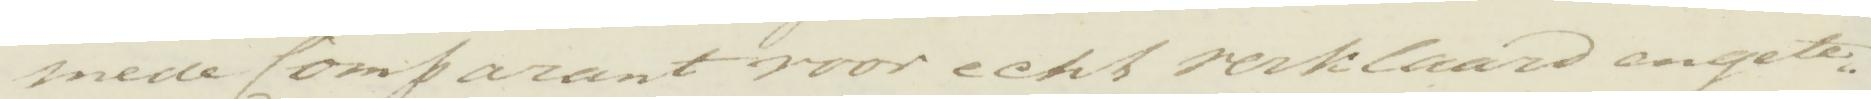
mede Comparant voor echt verklaard en gete„
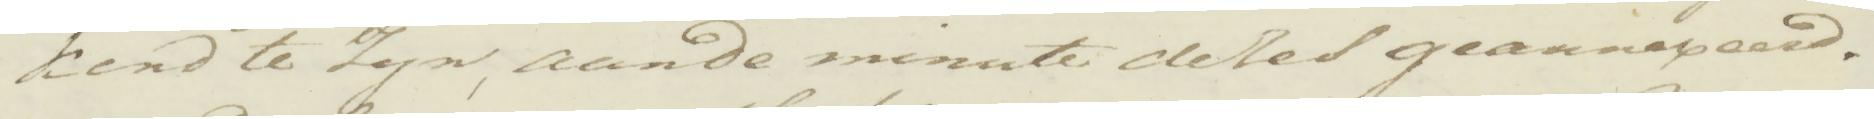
kend te zyn aan de minute dezes geannexeerd.
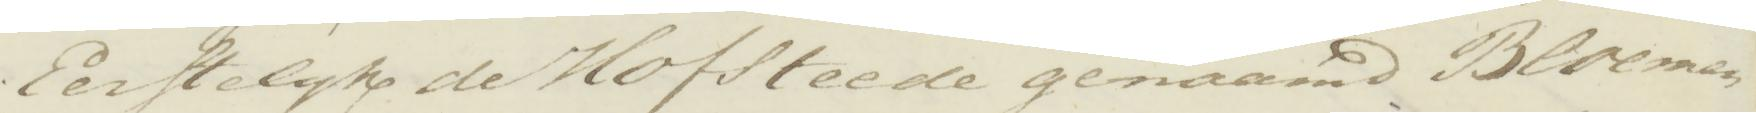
Eerstelyk de Hofsteede genaamd Bloemen
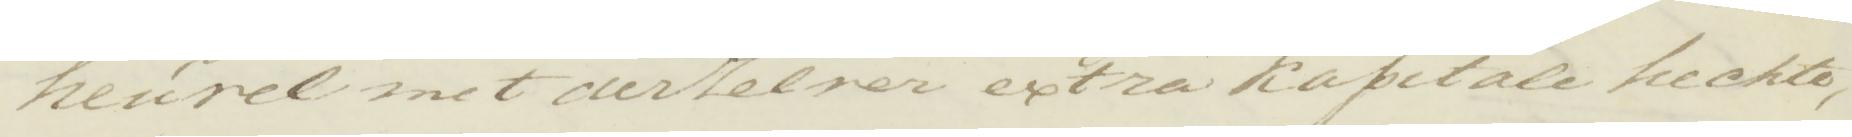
heuvel met derzelver extra kapitale hechte,
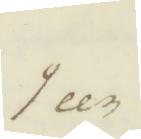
1 een
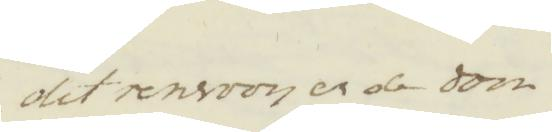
dit renvooy en de door
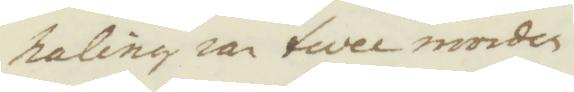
haling van twee woorden
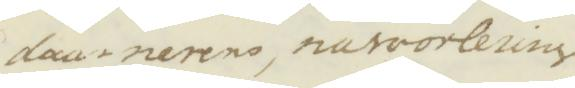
daarnevens, na voorlezing
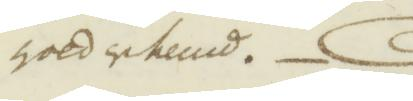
goed gekeurd. _ C
